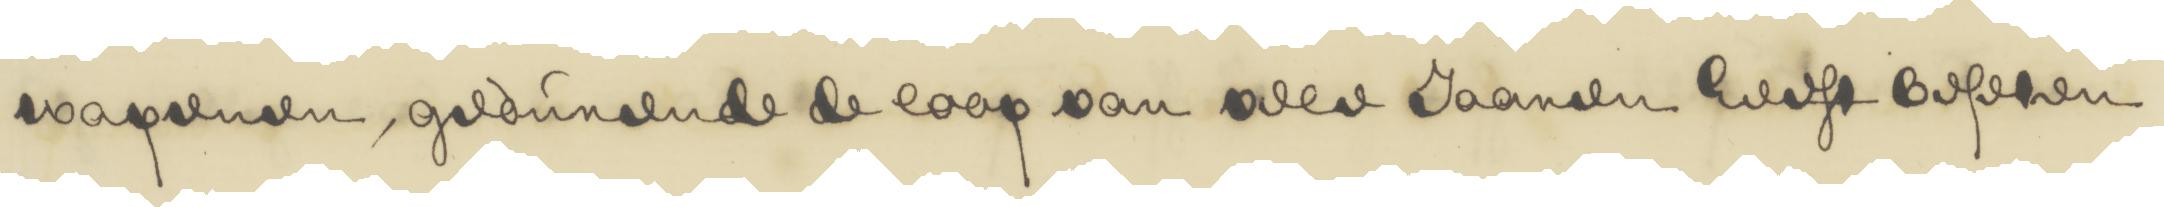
wapenen, gedurende de loop van vele Iaaren heeft beseten
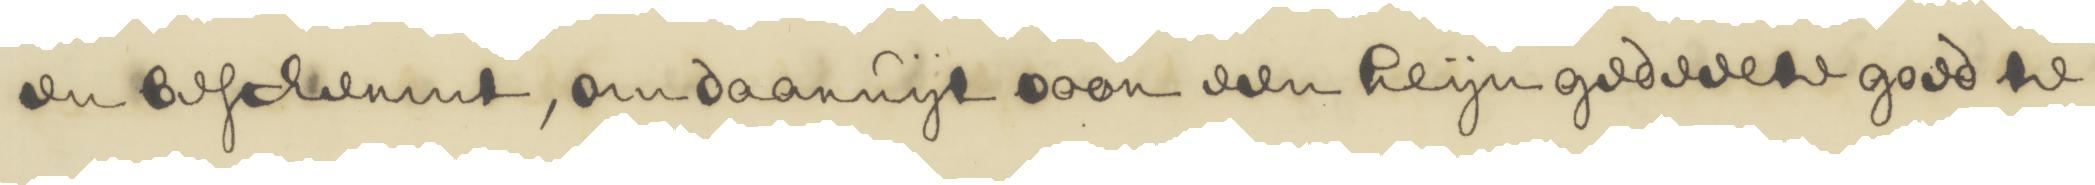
en beschermt, om daaruijt voor een klijn gedeelte goed te
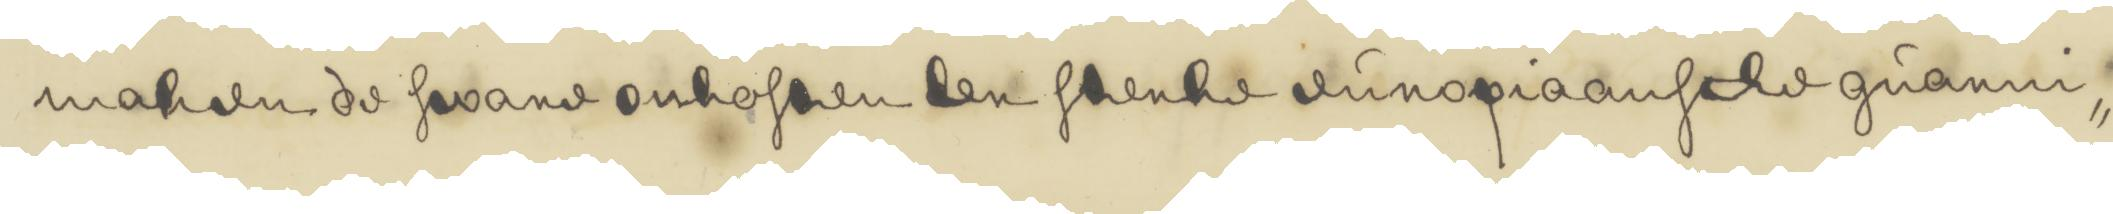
maken de sware onkosten der sterke europiaansche guarni„
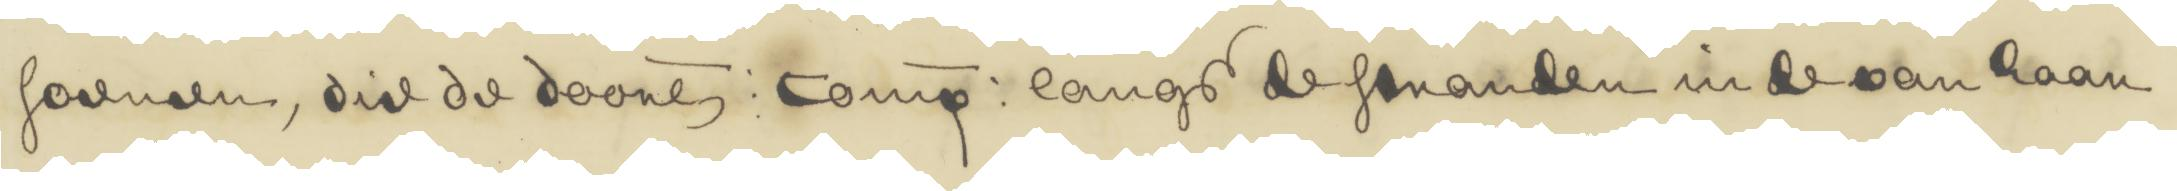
soenen, die de doorl: Comp: langs de stranden in de van haar
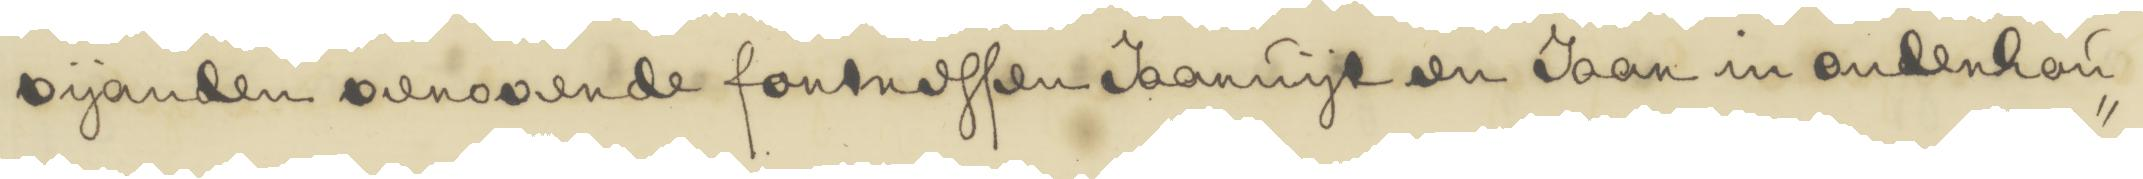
vijanden veroverde fortressen Iaaruijt en Iaar in onderhou„
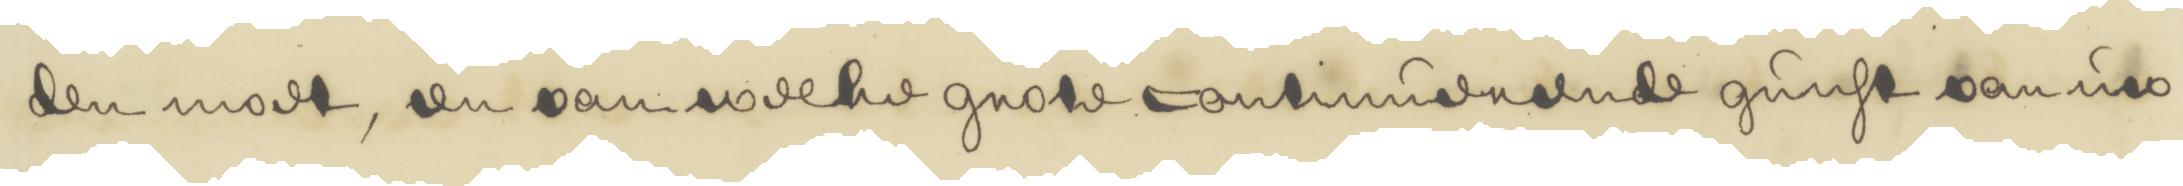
den moet, en van welke grote continuerende gunst van uw
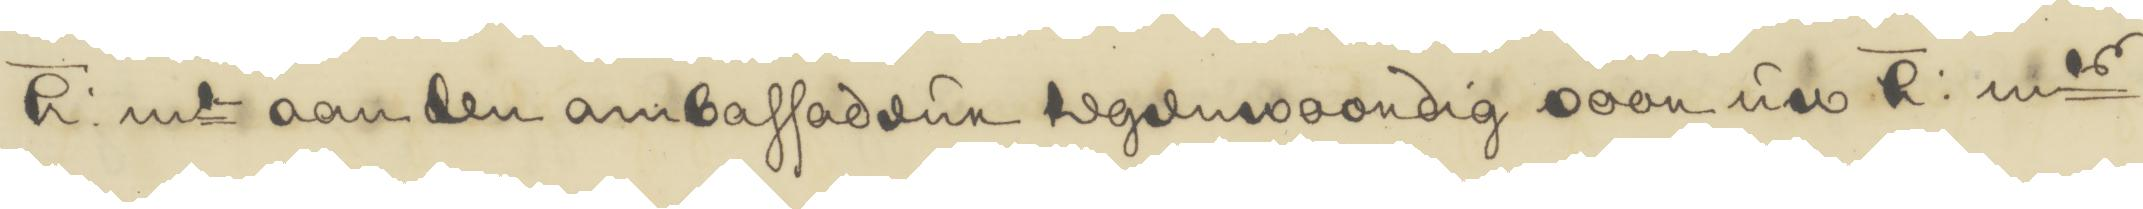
k: m=t aan den ambassadeur tegenwoordig voor uw k: m=ts
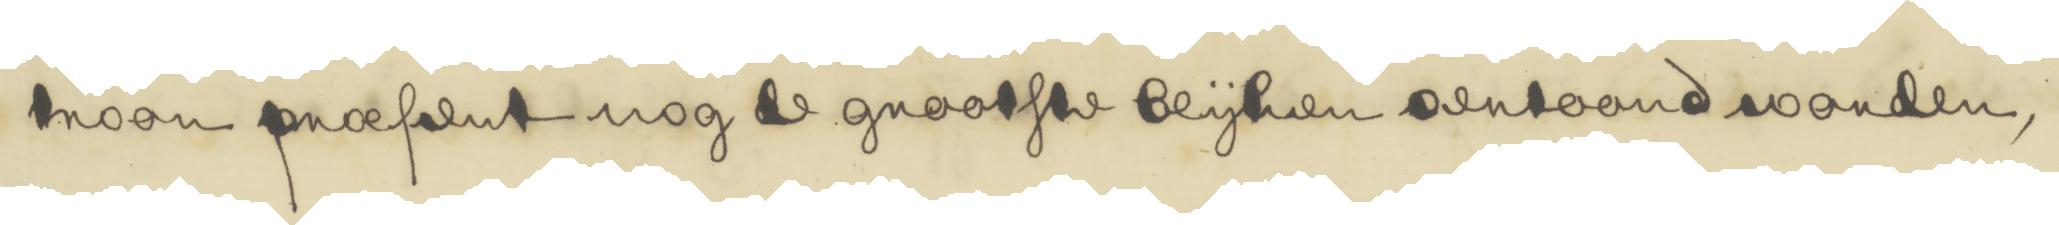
croon praesent nog de grootste blijken vertoond worden,
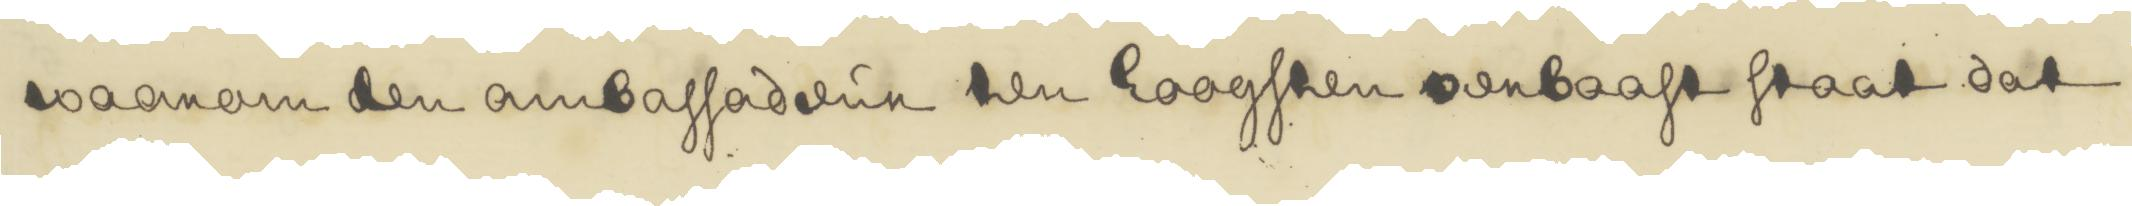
waarom den ambassadeur ten hoogsten verbaast staat dat
